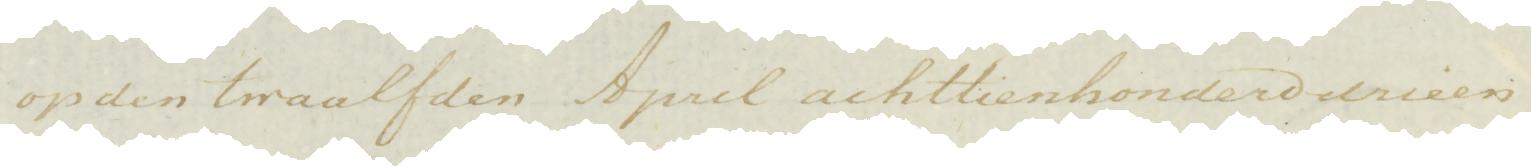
op den twaalfden April achttienhonderd drie en
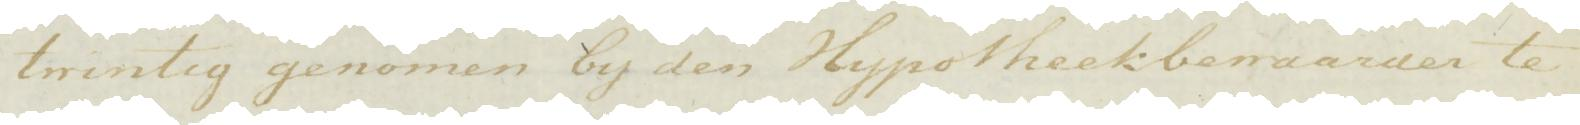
twintig genomen bij den Hypotheekbewaarder te
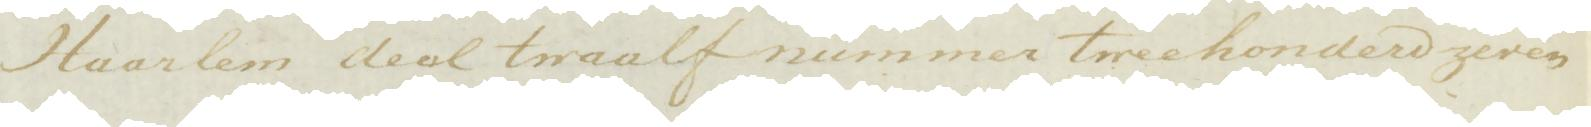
Haarlem deel twaalf nummer tweehonderd zeven
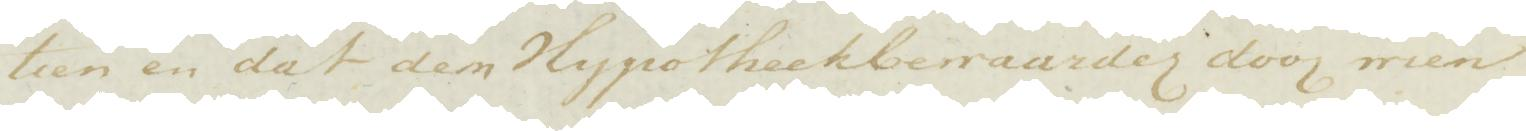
tien en dat den Hypotheekbewaarder door wien
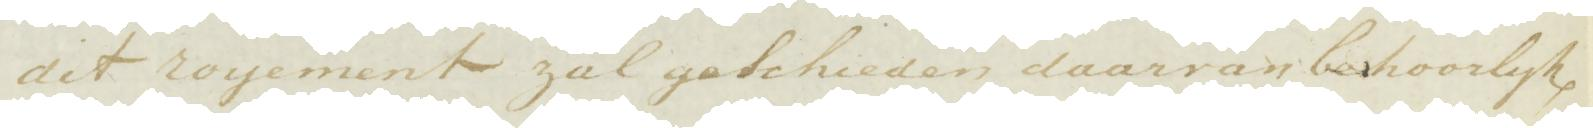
dit royement zal geschieden daarvan behoorlyk
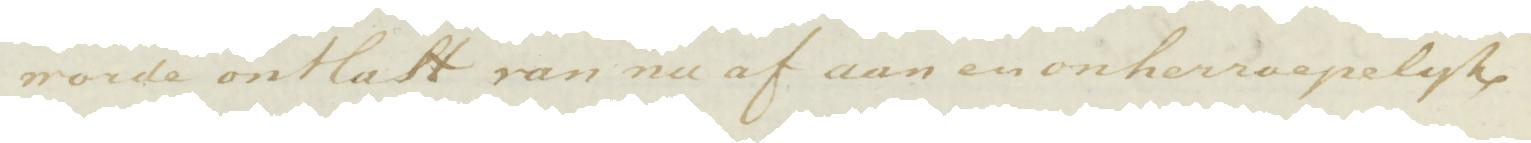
worde ontlast van nu af aan en onherroepelyk
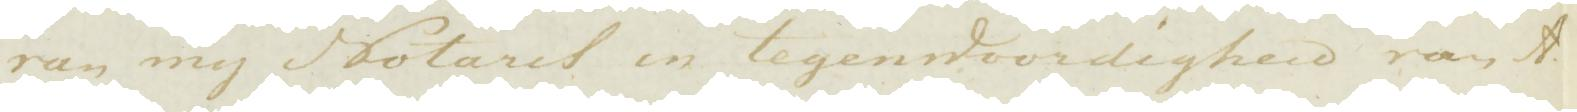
van mij Notaris in tegenwoordigheid van A.
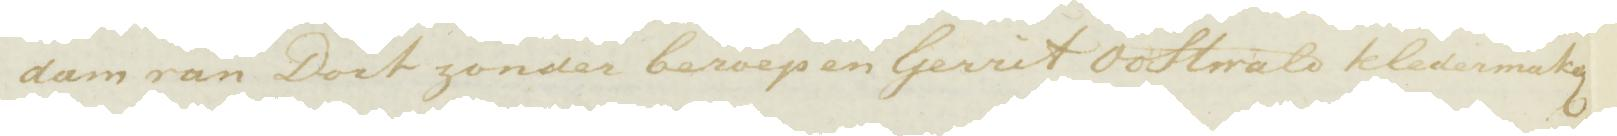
dam van Dort zonder beroep en Gerrit Oostwald kledermaker
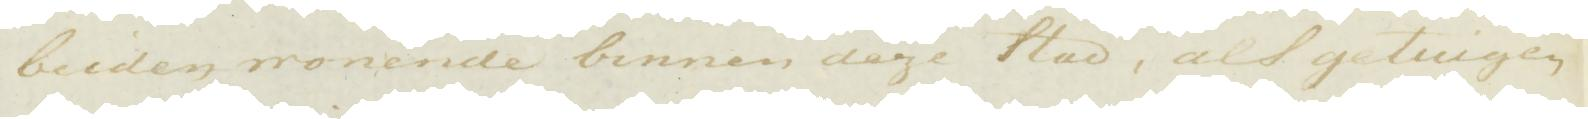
beiden wonende binnen deze stad, als getuigen
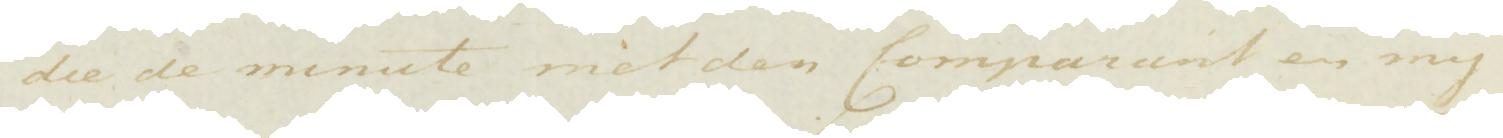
die de minute met den Comparant en my
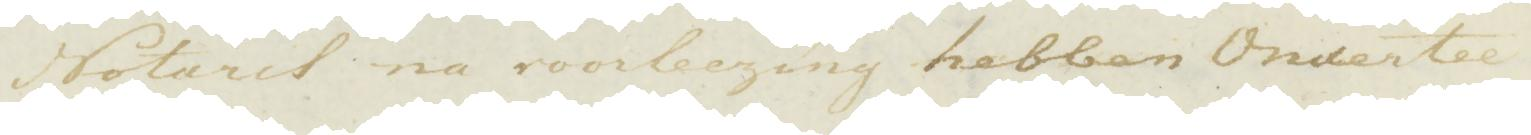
Notaris na voorleezing hebben Ondertee
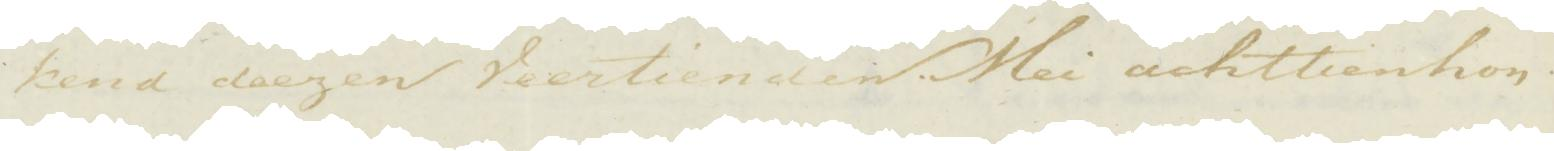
kend deezen Veertienden Mei achttienhon
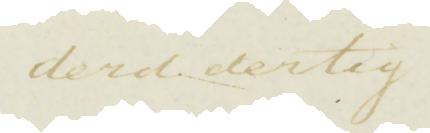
derd dertig
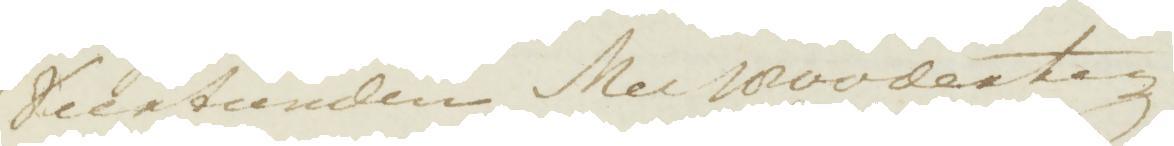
Veertienden Mei 1800 dertig
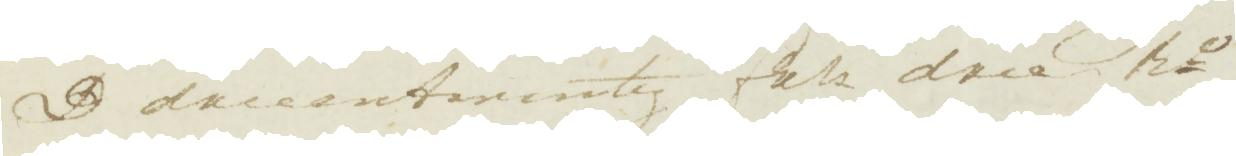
D drieentwintig fol drie R=o
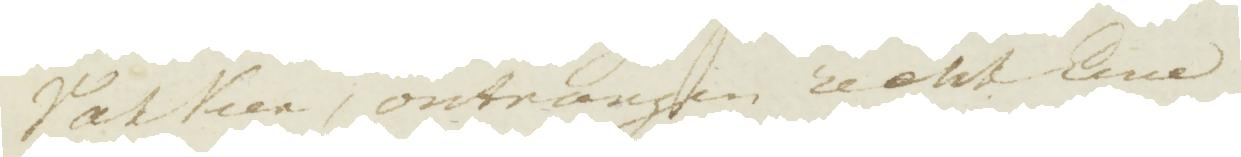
Vak Vier / ontvangen recht Eene
